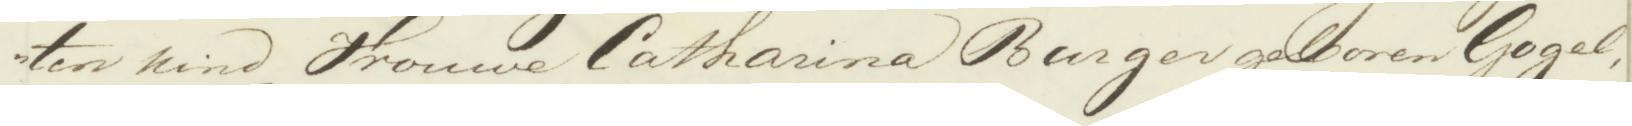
ten kind Vrouwe Catharina Burger geboren Gogel,
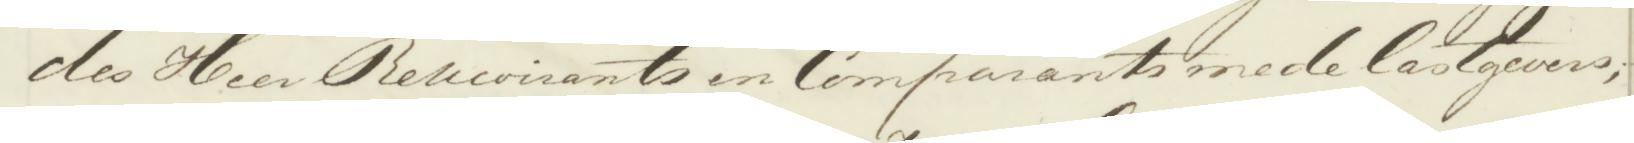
des Heer Rekwirants en Comparants mede lastgevers;
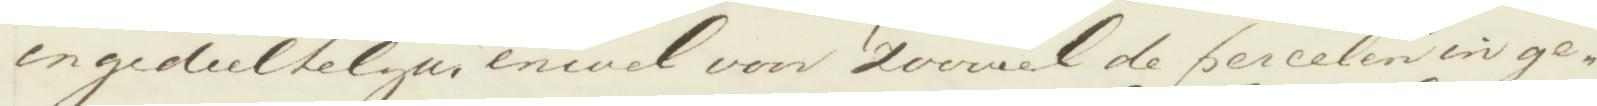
en gedeeltelyk, enwel voor zooveel de percelen in ge„
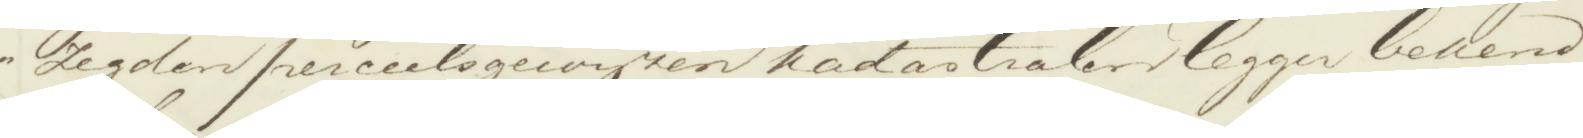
zegden perceelsgewyzen kadastralen legger bekend
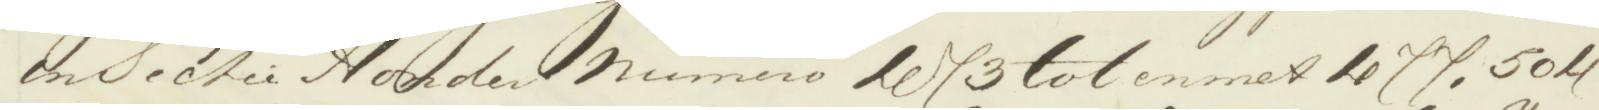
in sectie A onder Numero 473 tot enmet 477, 504
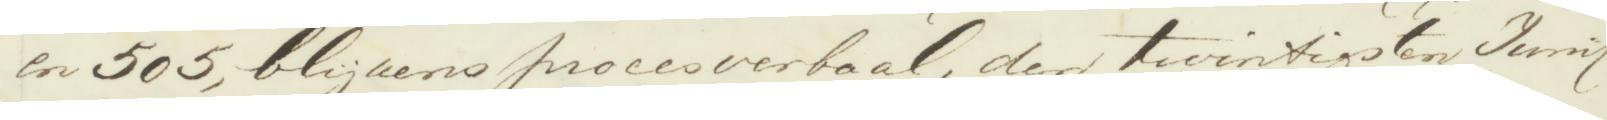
en 505, blijkens proces verbaal, den twintigsten Iunij
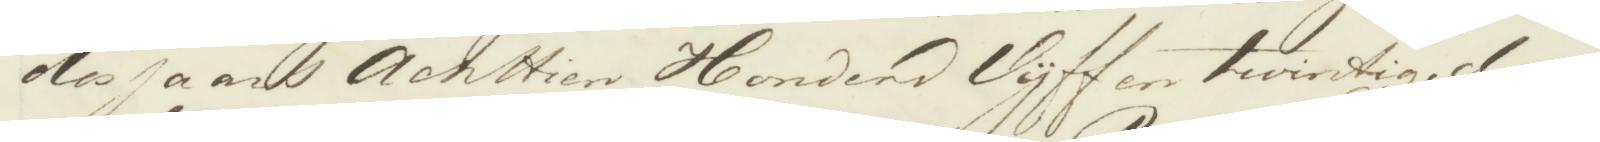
des jaars Achttien Honderd Vijff en twintig, door
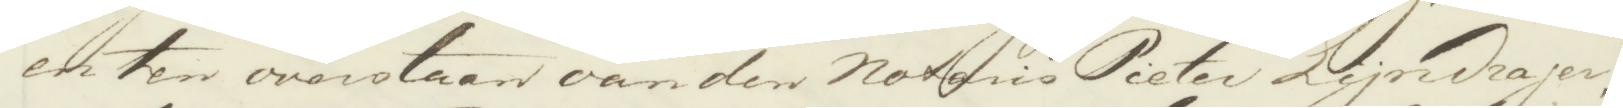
en ten overstaan van den Notaris Pieter Lijndrajer,
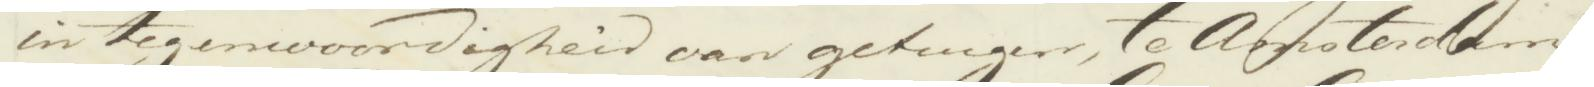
in tegenwoordigheid van getuigen, te Amsterdam
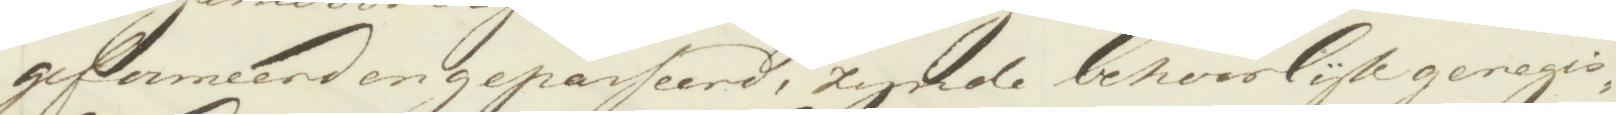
geformeerd en gepasseerd, zynde behoorlijk geregis„
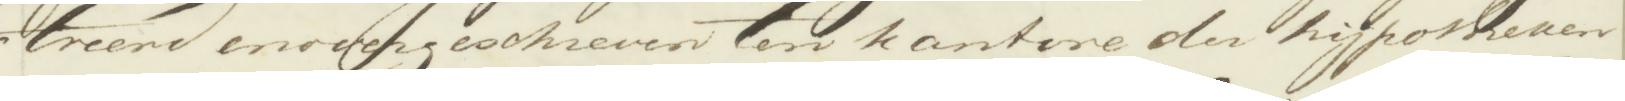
„treerd en overgeschreven ten kantore der hijpotheken
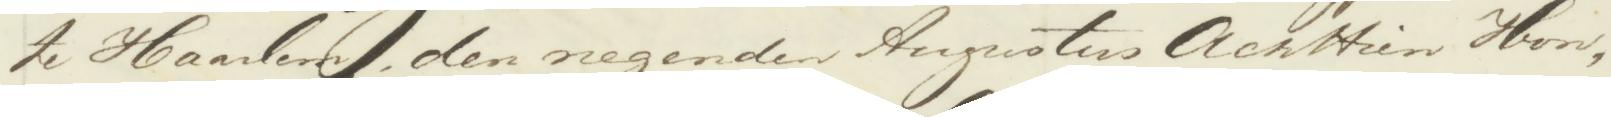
te Haarlem, den negenden Augustus Achttien Hon„
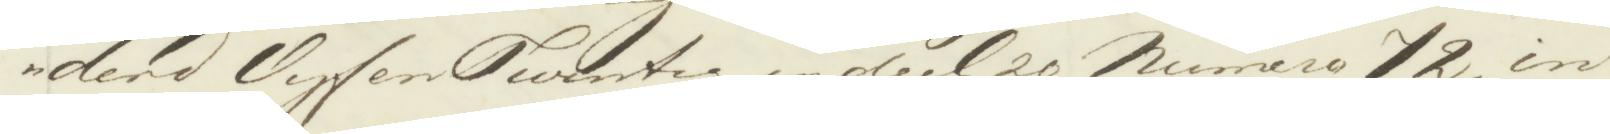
derd Vyf en Twintig in deel 20 Numero 72, in
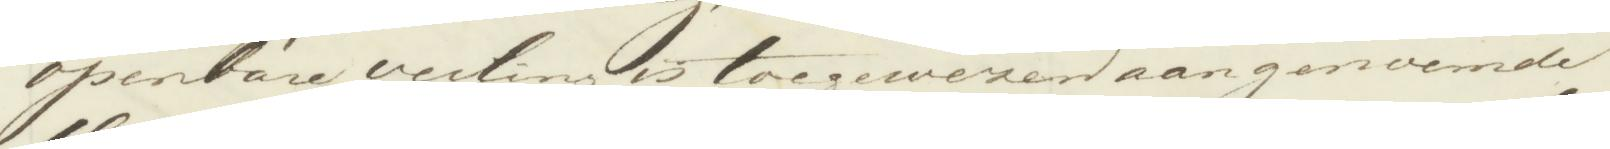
openbare veiling is toegewezen aan genoemde
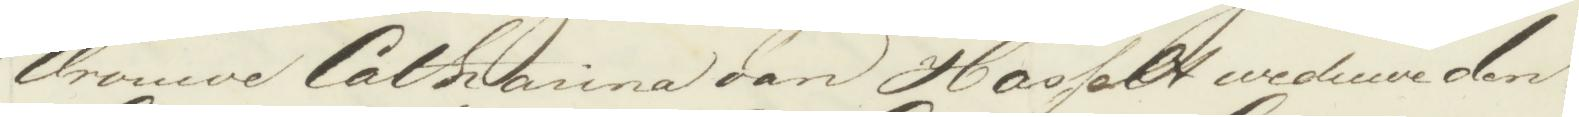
Vrouwe Catharina van Hasselt weduwe den
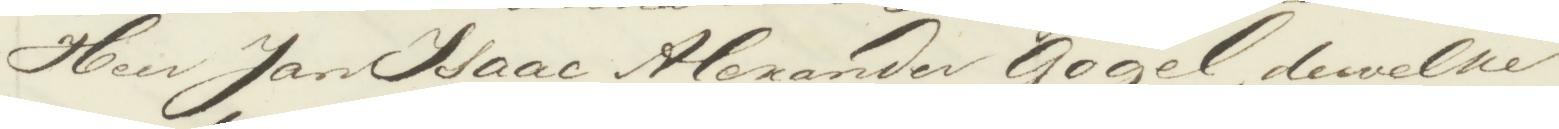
Heer Jan Isaac Alexander Gogel, dewelke
